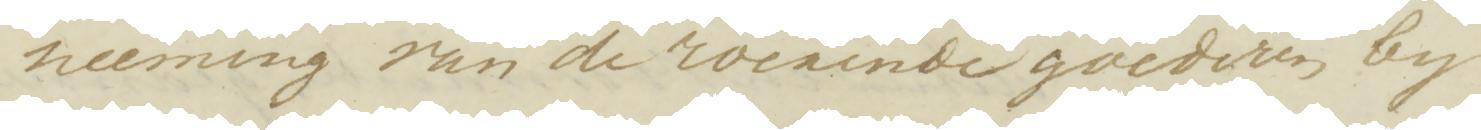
neeming van de roerende goederen by
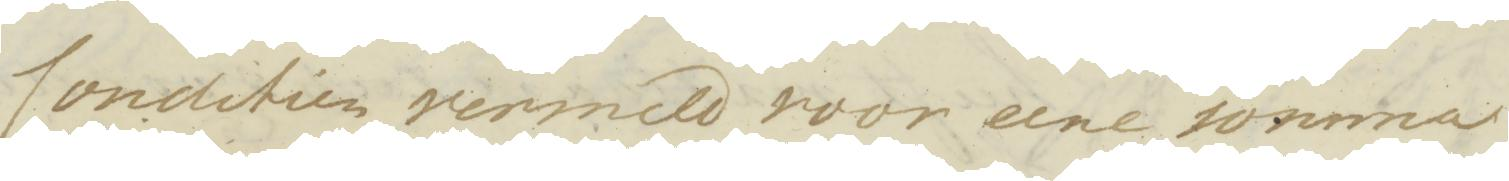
Conditien vermeld voor eene sonma
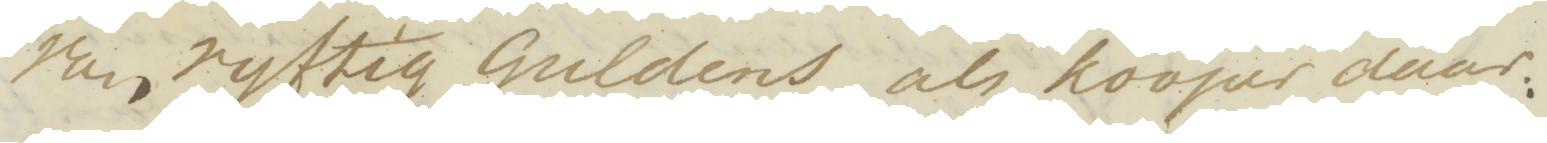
van vyftig Guldens, als kooper daar:
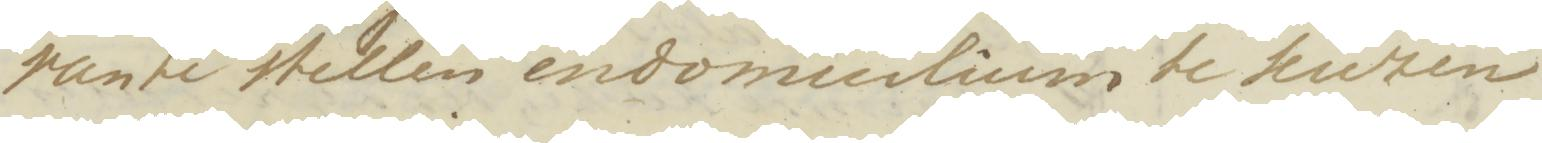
van te stellen en domicilium te kiezen
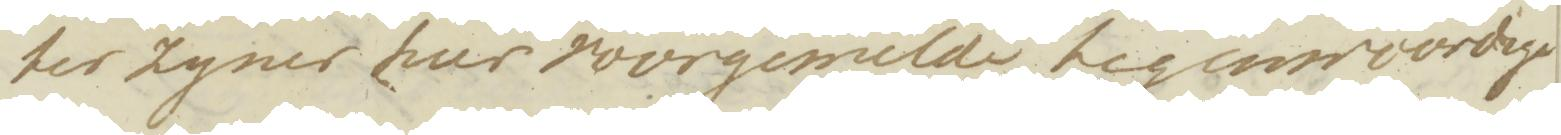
ter zyner hier voorgemelde tegenswoordige
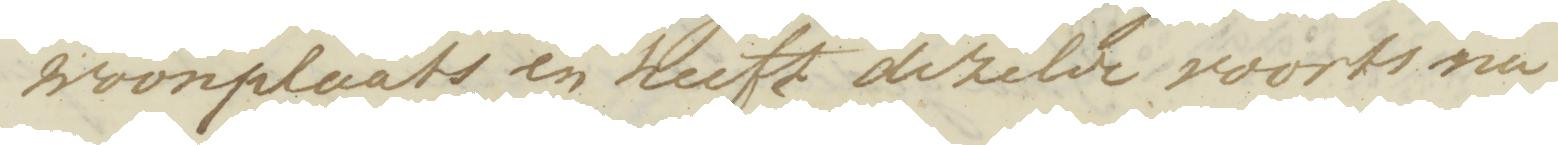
woonplaats en heeft dezelve voorts na
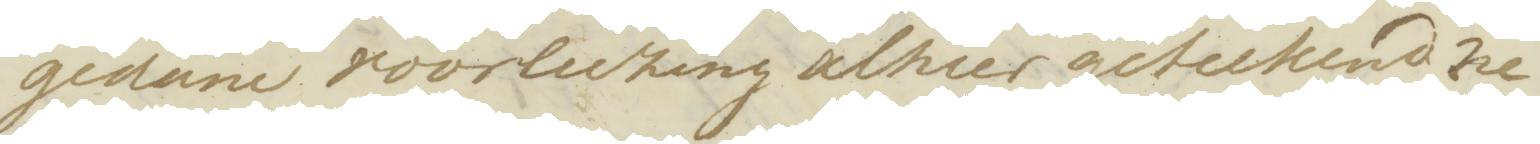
gedane voorleezing alhier geteekend ne:
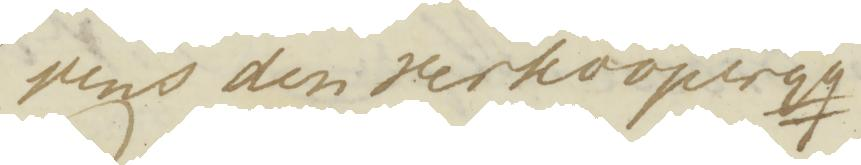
=vens den verkooper qq
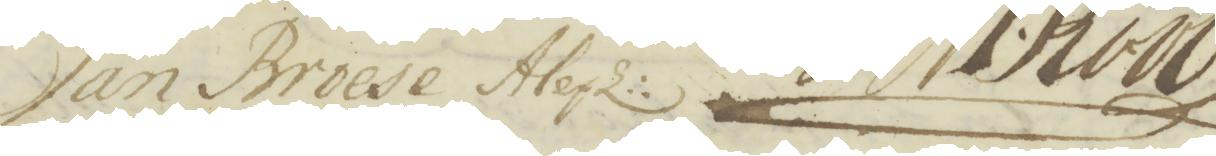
Jan Broese Alexz.: JM: Rood
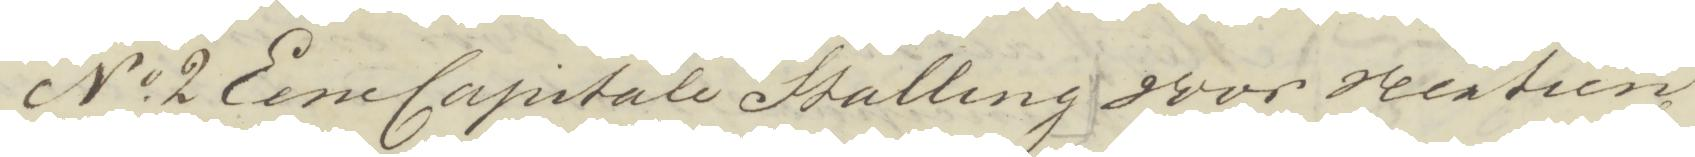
N.o 2 Eene Capitale stalling voor veertien
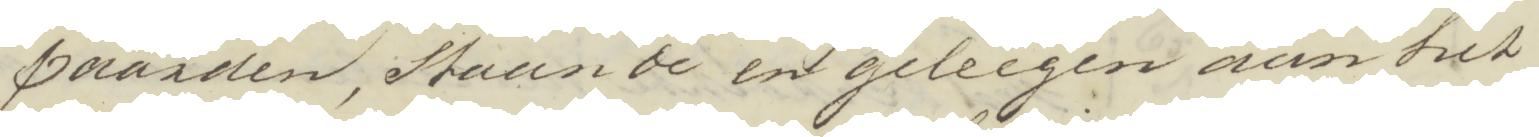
paarden, staande en geleegen aan het
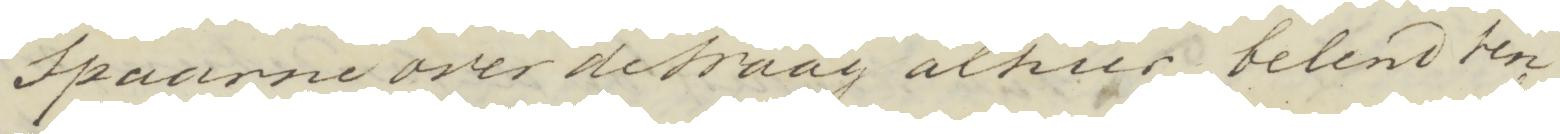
Spaarne over de Waag alhier, belend ten
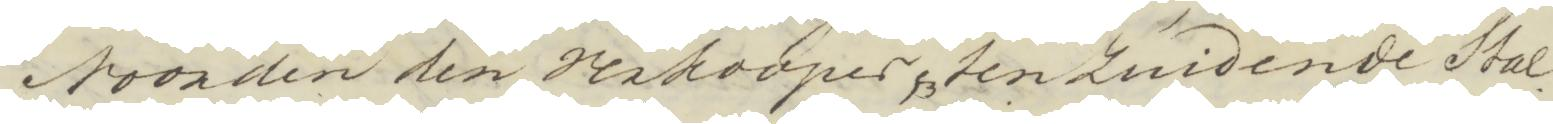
Noorden den verkooper, ten zuiden de Stal
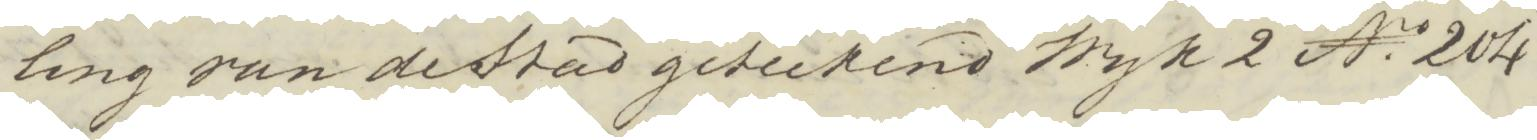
ling van de Stad geteekend Wyk 2 N.o 204
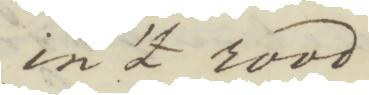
in ’t rood
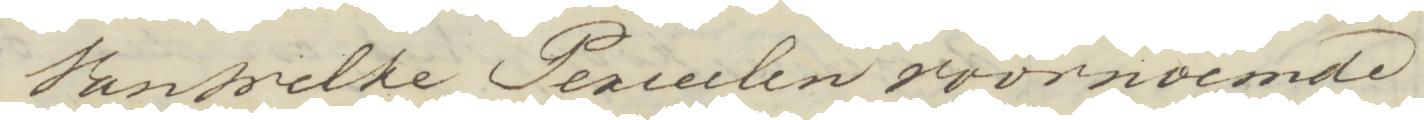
Van welke Perceelen voornoemde
